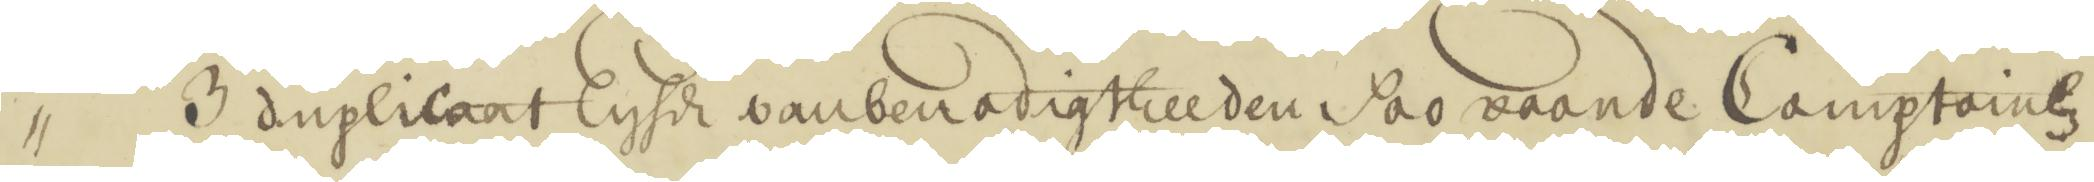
„ 3 duplicaat Eysch van benodigtheeden soo voorde Comptoiren
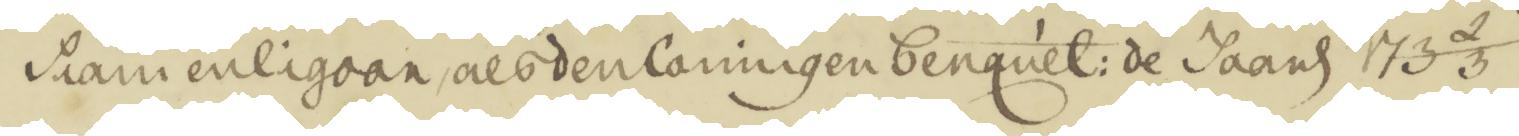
Siam en ligoan als den Coningen berquel: de Iaaren 173 2/3
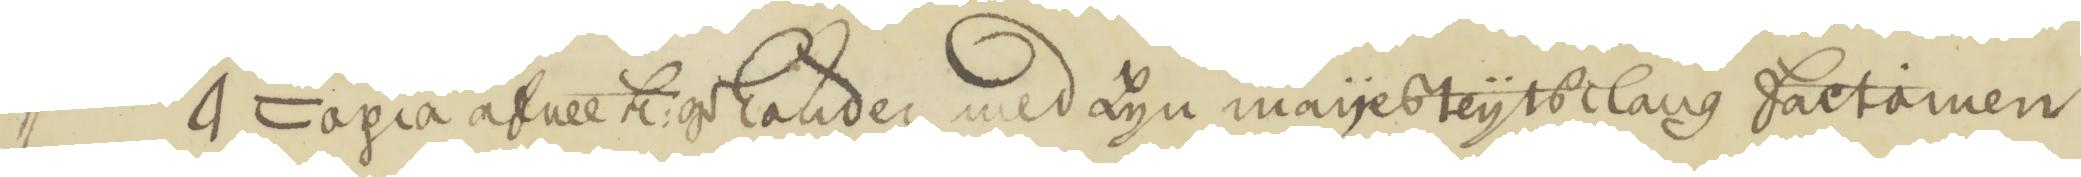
„ 4 Copia afreek: gehouden med Zyn maijesteijts clang factoiren
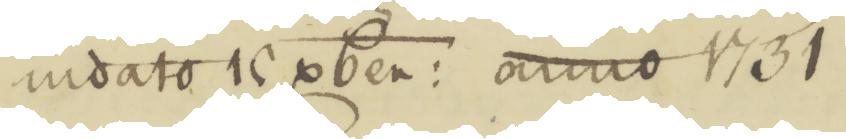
in dato 15 xber: anno 1731
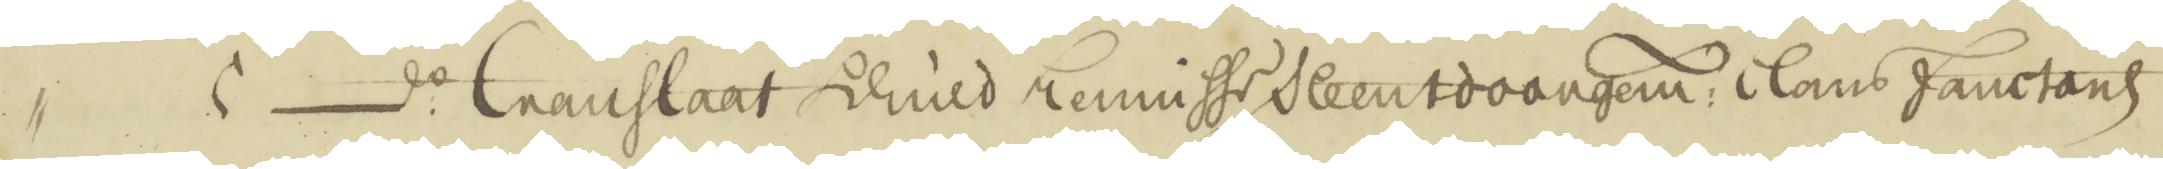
„ 5 -:o translaat schuld kennisse verleent doorgem: clans fanctoren
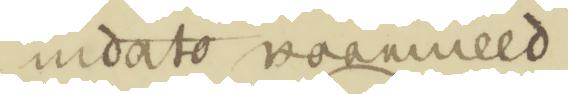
in dato voormeld
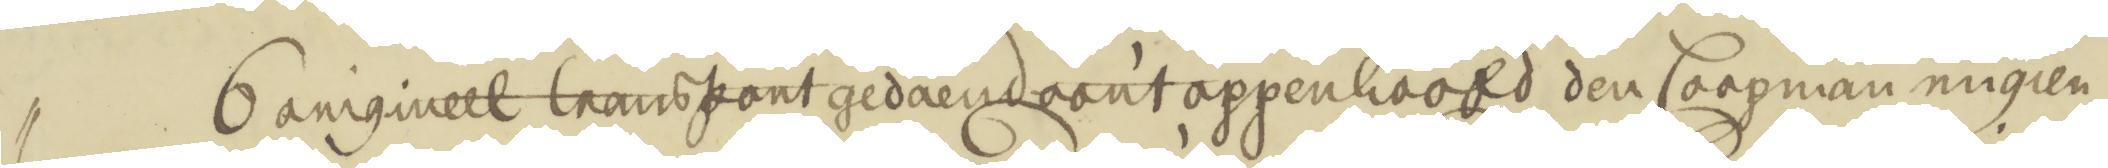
„ 6 origineel transport gedaen door 't opperhoofd den Coopman rugier
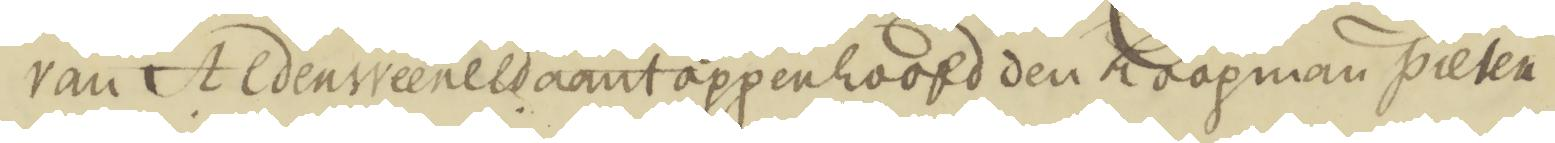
van Alderweereld aan 't opperhoofd den koopman pieter
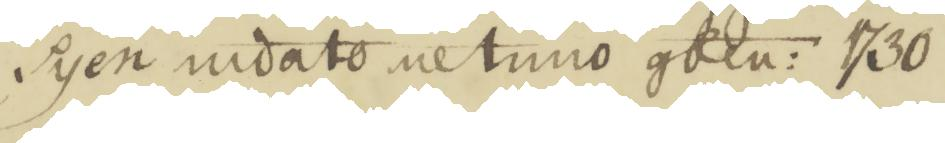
Syen in dato ultimo gber: 1730
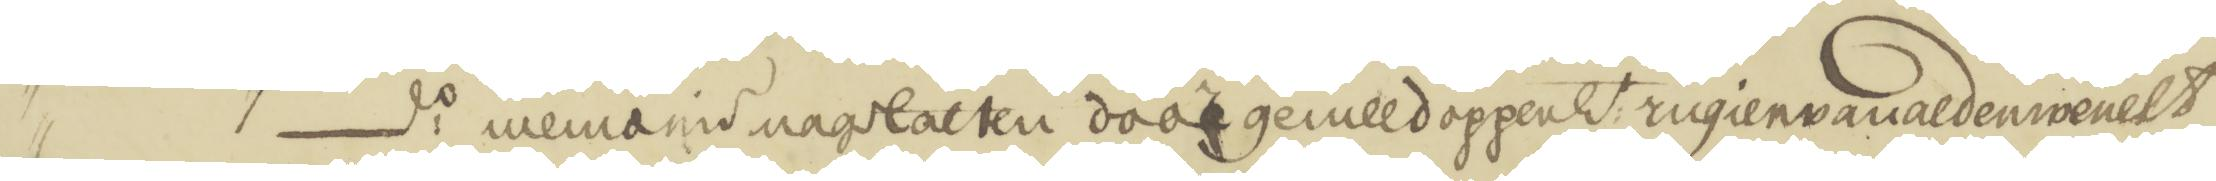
„ 7 _„o memorie nagelatten door gemeld opperh:t rugier van alderwerelt
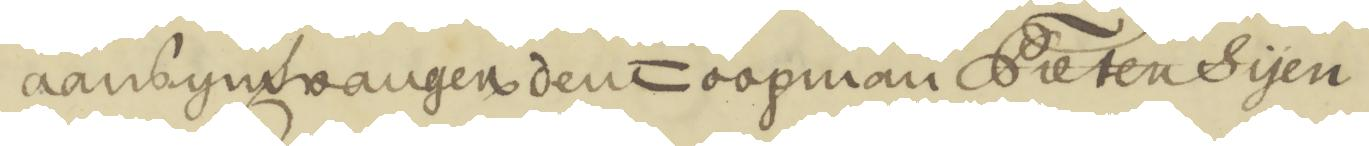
aansyn vervanger den Coopman Pieter Sijen
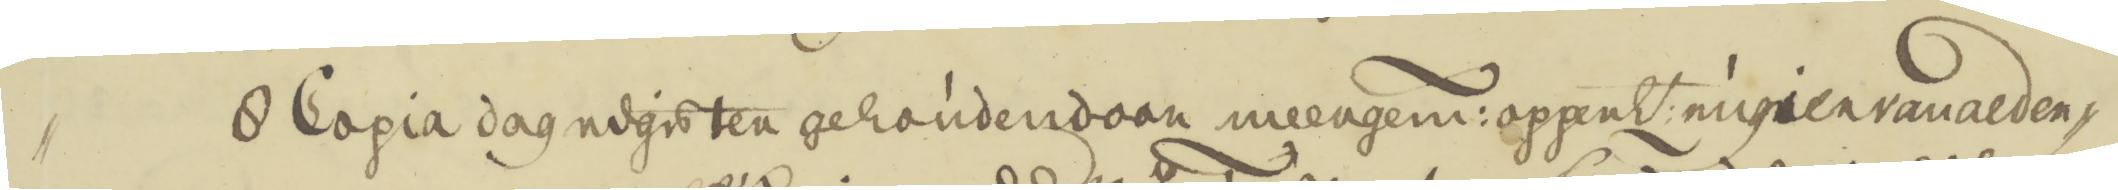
„ 8 Copia dag register gehouden door meer gem: opperh:t rugier van alder„
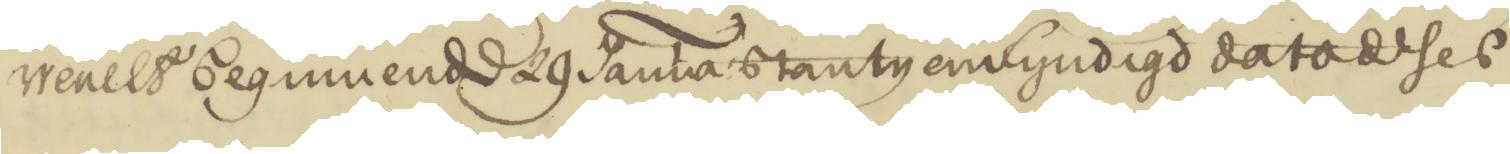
werelt beginnen de 29 Janua: 'stanty en Eyndigd dato deses
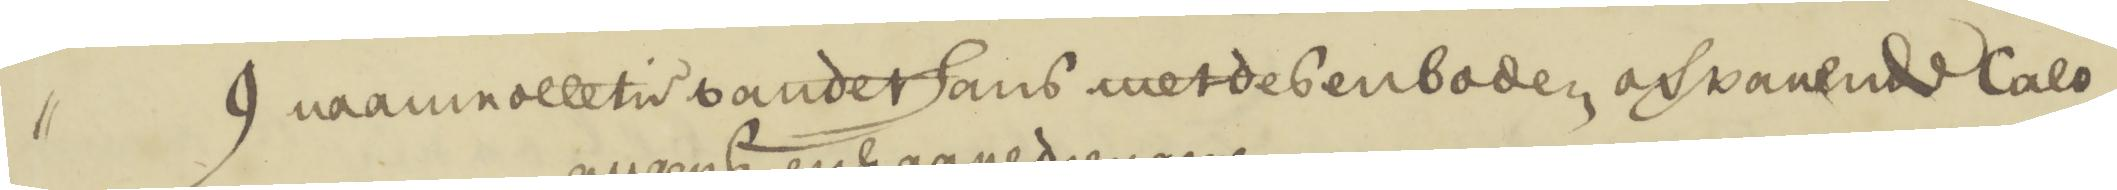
„ 9 naam rolletie van dethans met desen boden overvarende Calo
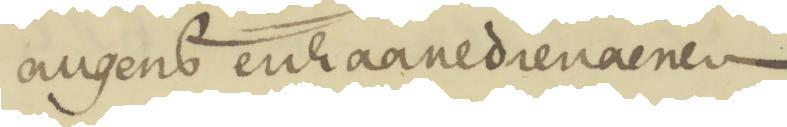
angens en haare dienaeren
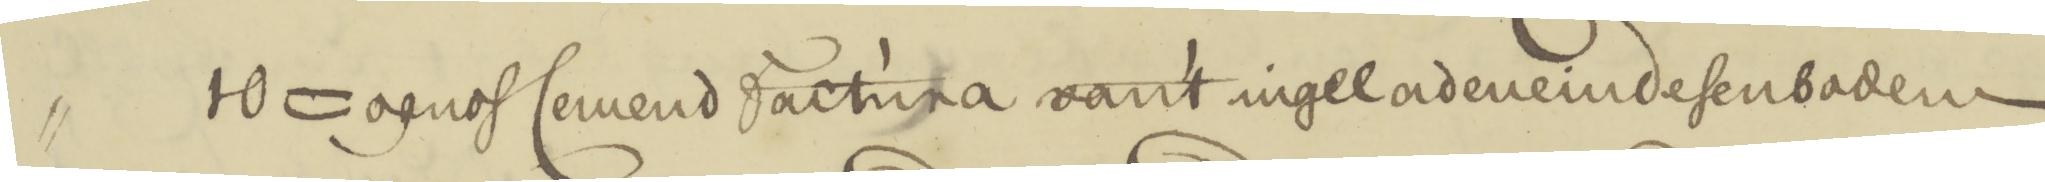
„ 10 Cognoscemend factura van 't ingeladeneindese nbodem
